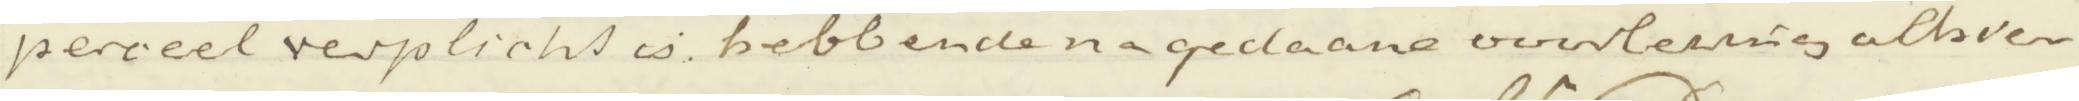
perceel verplicht is, hebbende nagedaane voorlezing alhier
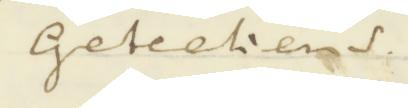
Geteekend.
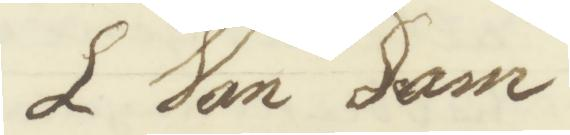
L Van Dam
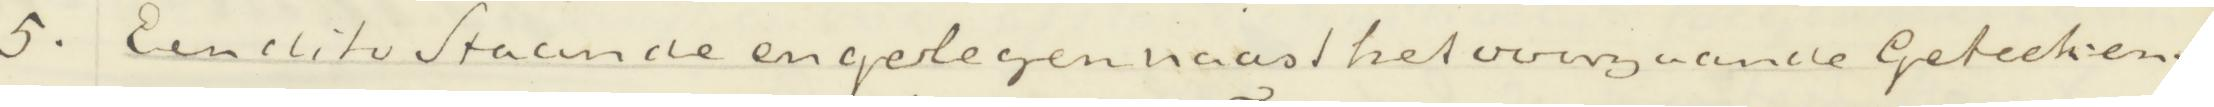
5. Een dito staande en gelegen naast het voorgaande Geteekend
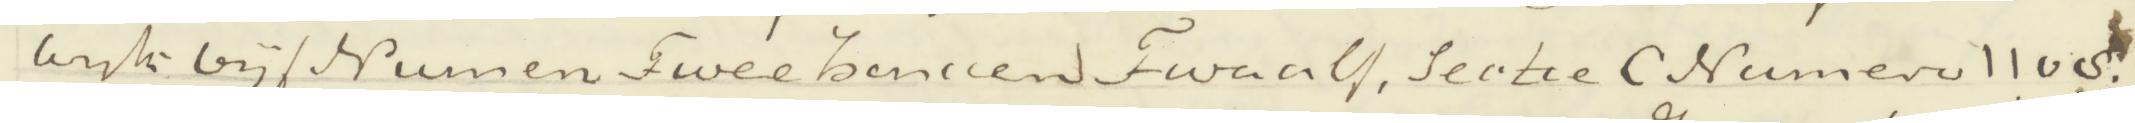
wyk vijf Numero Twee honderd Twaalf, sectie C Numero 1108.
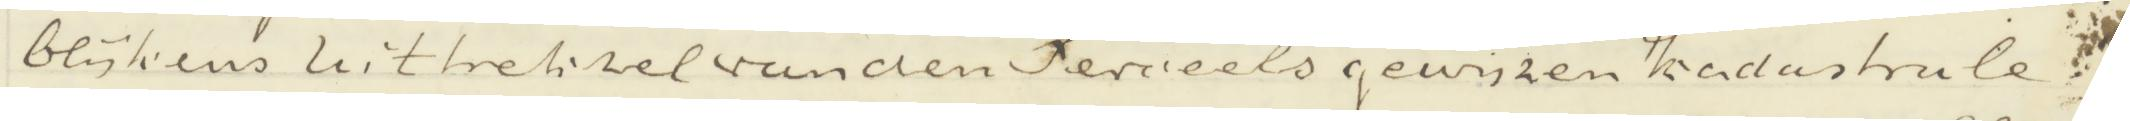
blijkens uittrekzel van den Perceels gewijzen Kadastrale
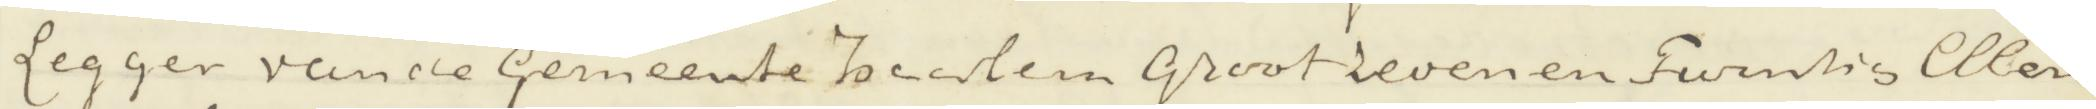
Legger van de Gemeente haarlem Groot zeven en Twintig Ellen
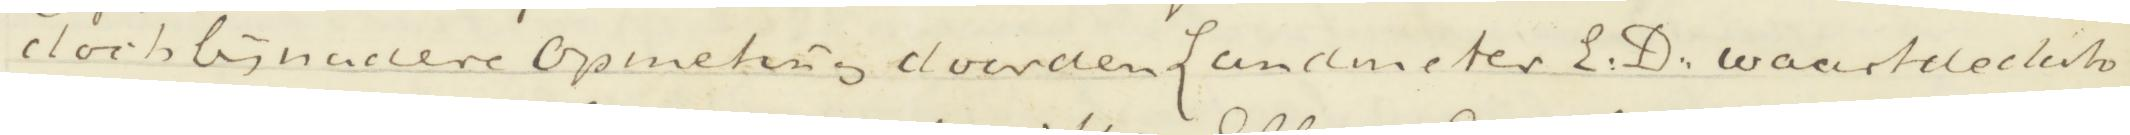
doch bij nadere opmeting door den Landmeter L:D: waart de dato
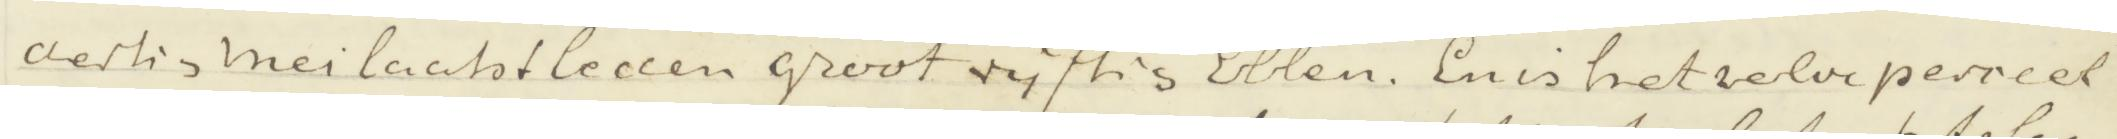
dertig mei laatstleden groot vijftig Ellen. En is het zelve perceel
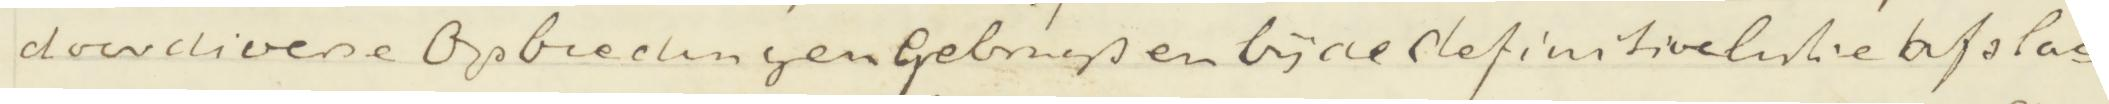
door diverse Opbiedingen gebragt en bij de definitivelyke afslag
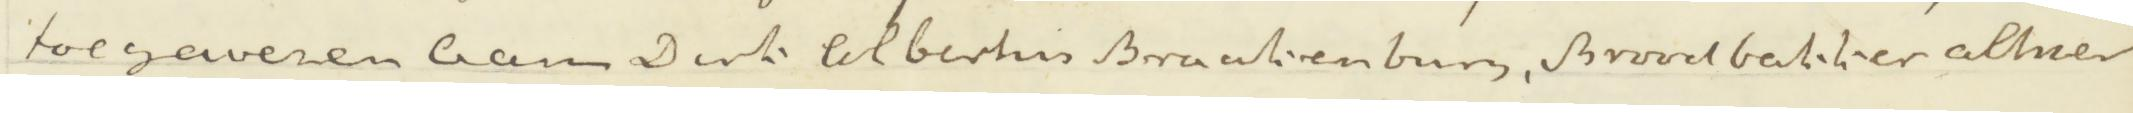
toegewezen aan Dirk Albertus Braakenburg, Broodbakker alhier
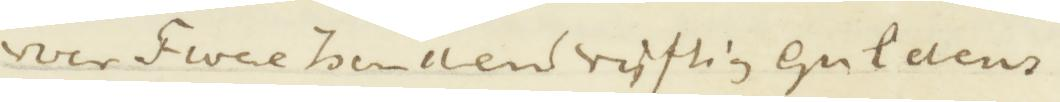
voor Twee honderd vijftig Guldens
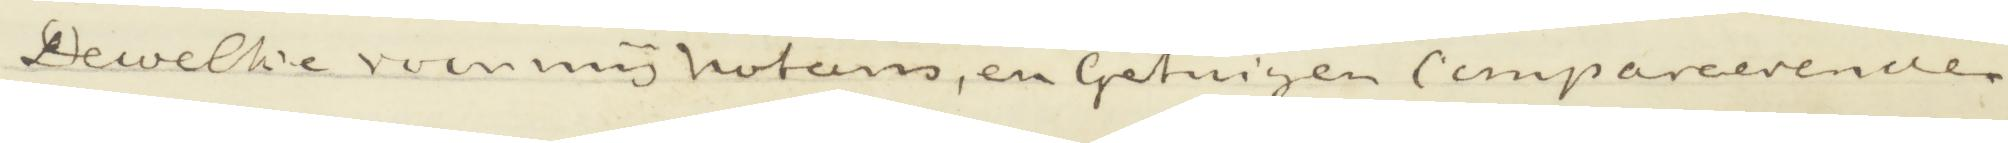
Dewelke voor mij notaris, en Getuigen Compareerende,
